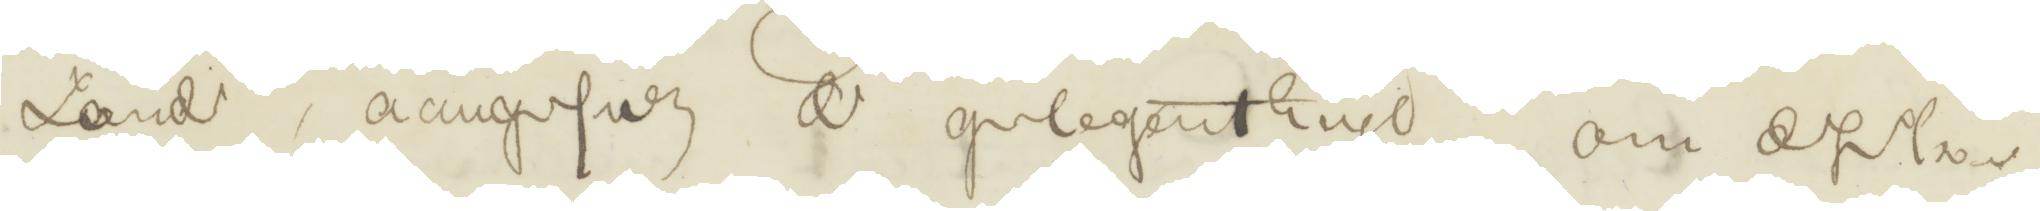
zoude, aangesien de gelegentheijd om deselve
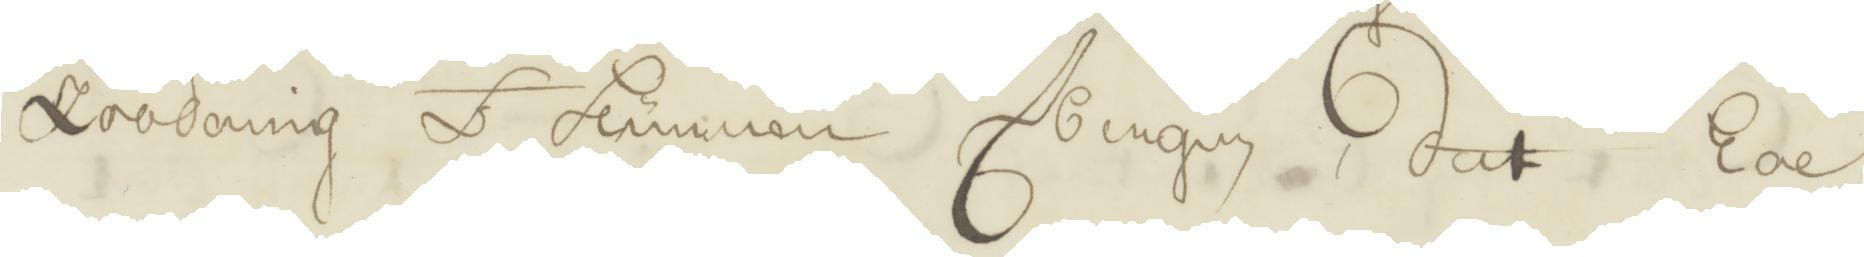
zoodanig te kunnen verbergen, dat hoe
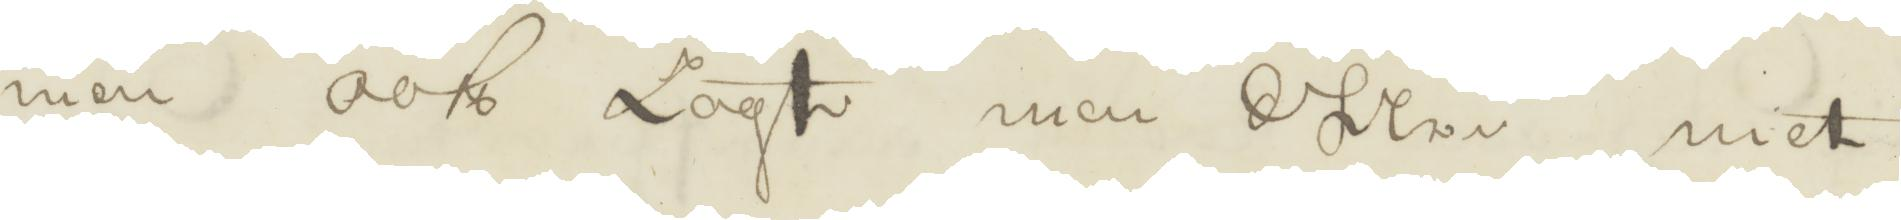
men ook zogte men deselve niet
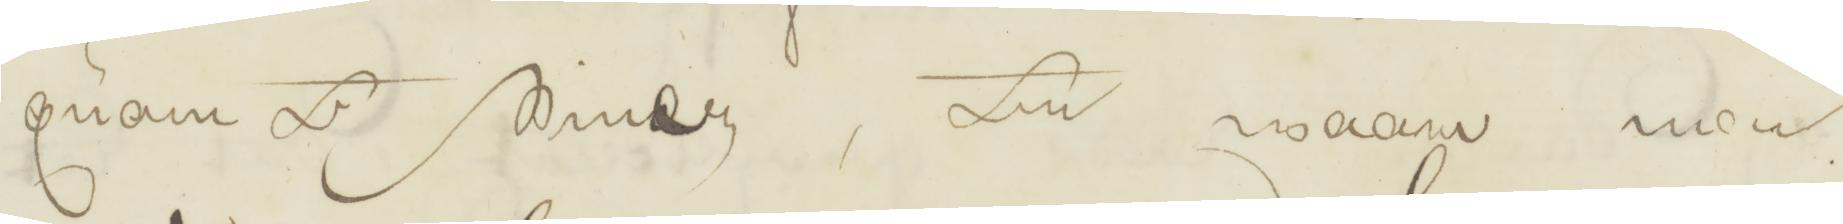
quam te vinden ten waare men
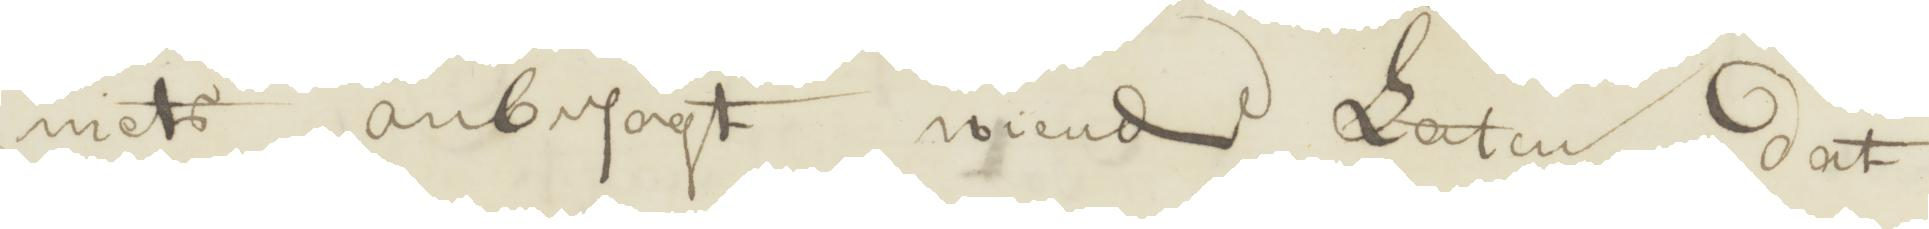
niets onbesorgt wierde Laten, dat
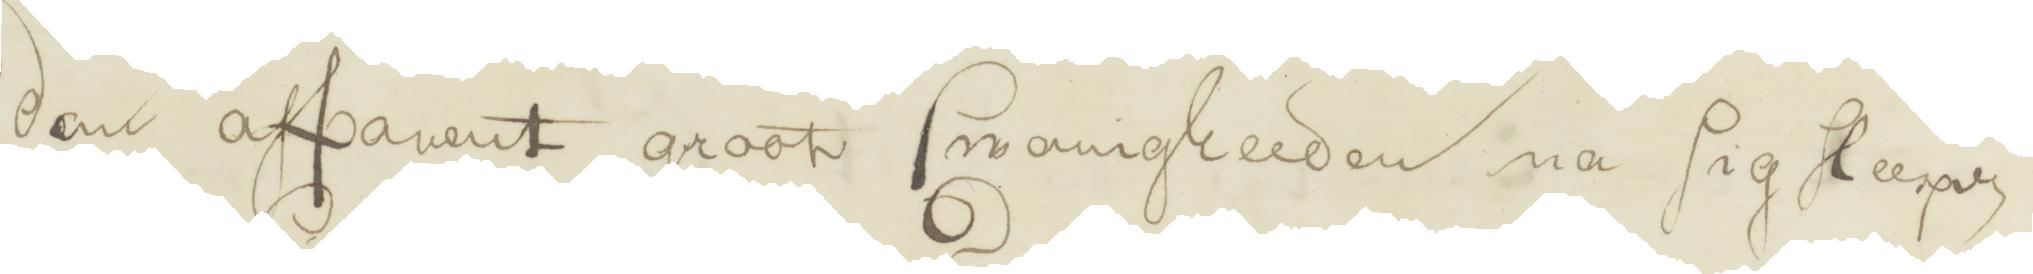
dan apparent groot swarigheeden na sig sleepen
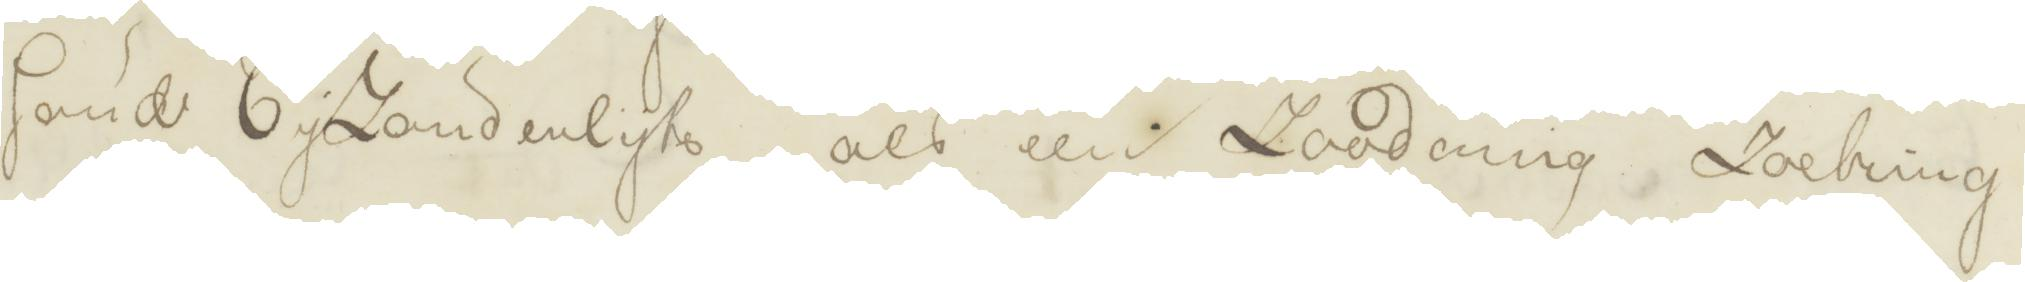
soude bijzonderlijk als een zoodanig, zoeking
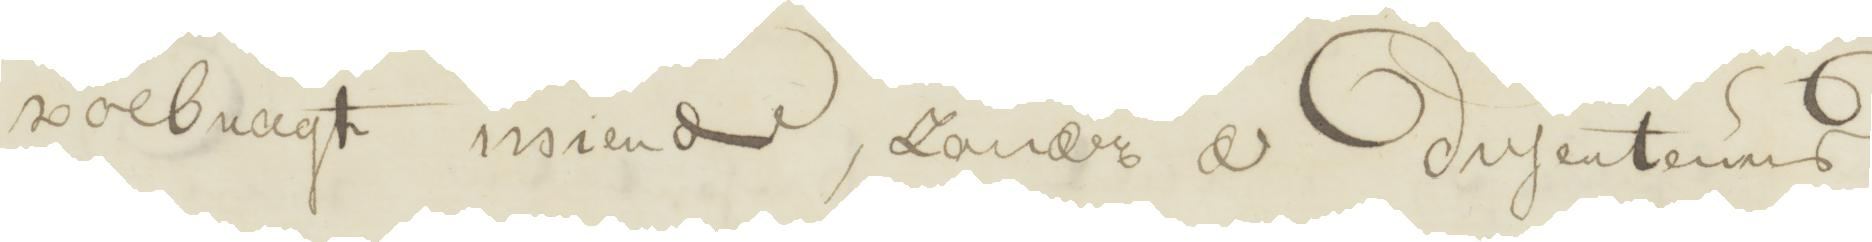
volbragt wierde, zonder de deserteurs
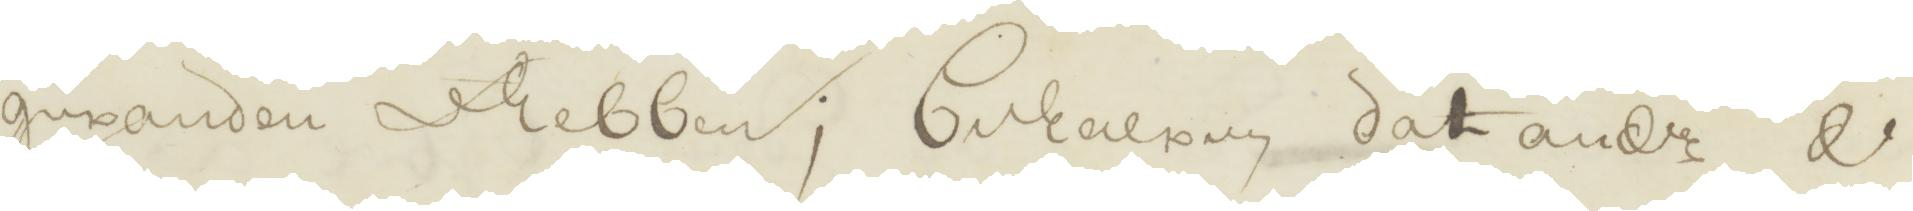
gevonden te hebben; behalven dat onder de
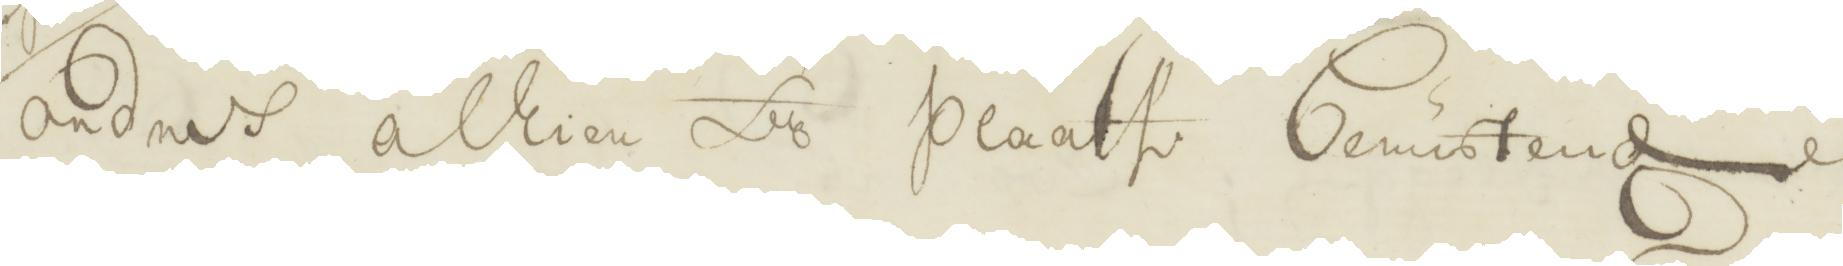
ordres alhier ter plaatse berustende
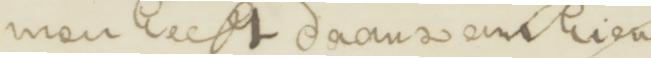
men heeft daar van thier
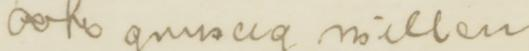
ook gewag willen
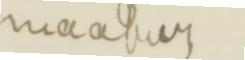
maaken
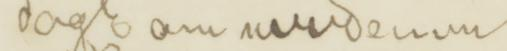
dogh om reedenen
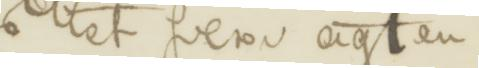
s het selve agter
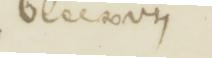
bleeven
